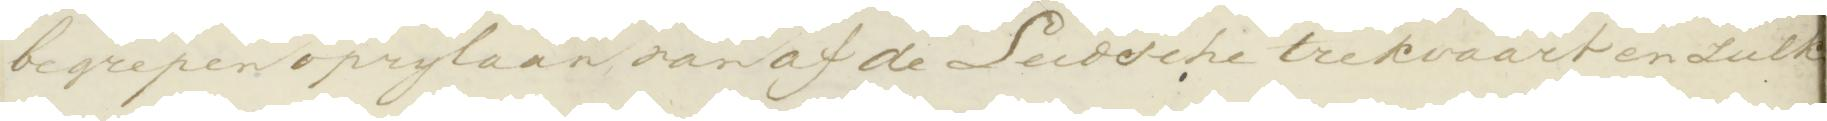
begrepen oprylaan van af de Leidsche trekvaart en zulk
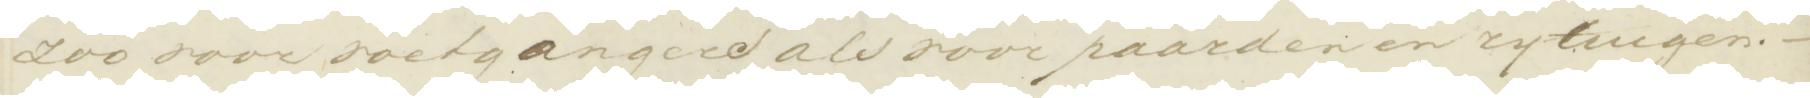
zoo voor voetgangers als voor paarden en rytuigen. —
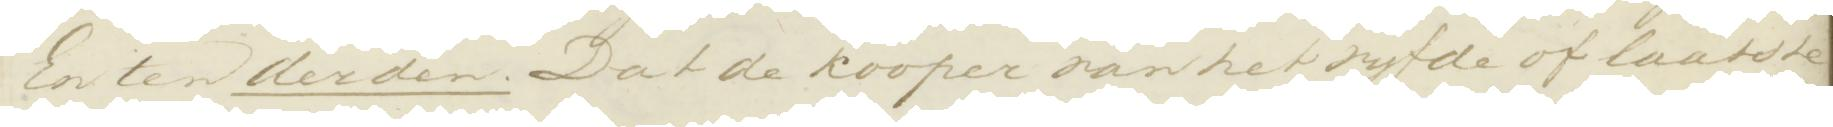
En ten derden. Dat de kooper van het vyfde of laatste
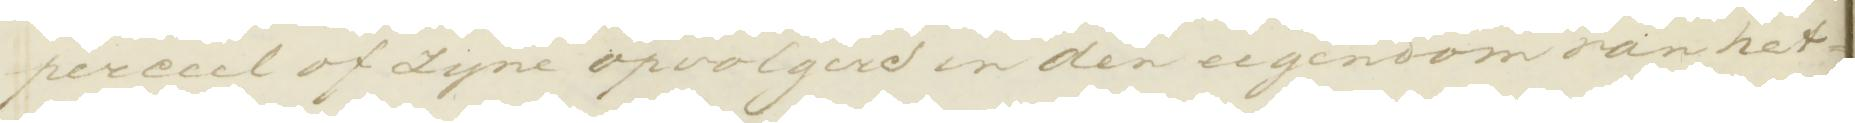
perceel of zijne opvolgers in den eigendom van het„
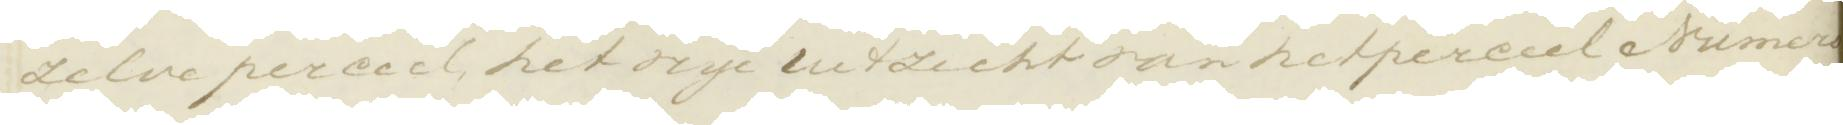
zelve perceel, het vrye uitzicht van het perceel Numero
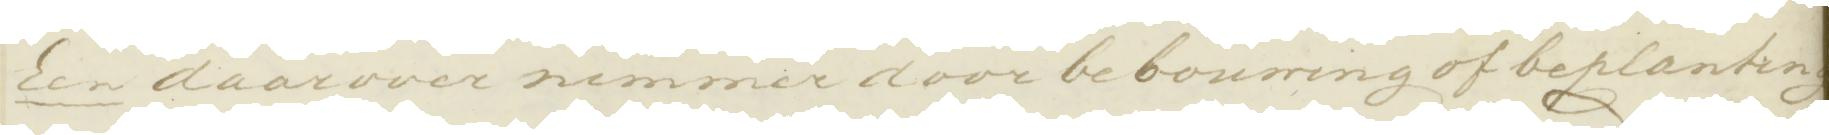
Een daarover nimmer door bebouwing of beplanting
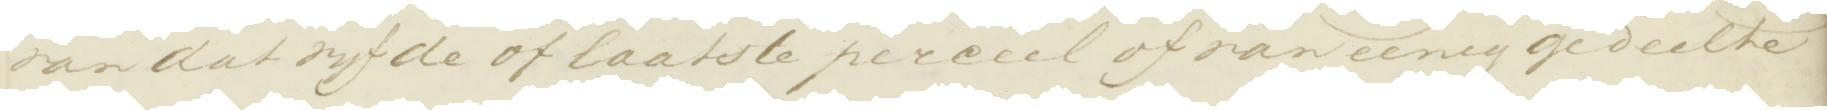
van dat vyfde of laatste perceel of van eenig gedeelte
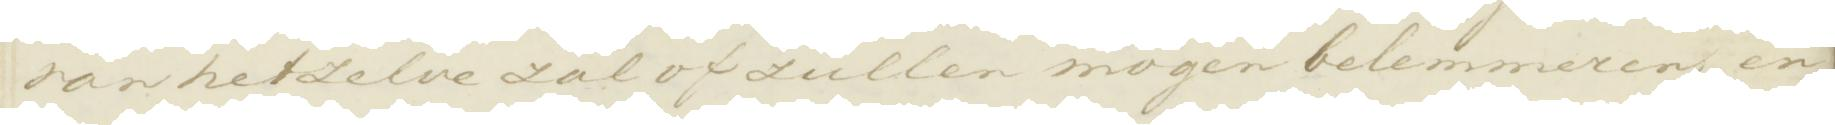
van hetzelve zal of zullen mogen belemmeren en
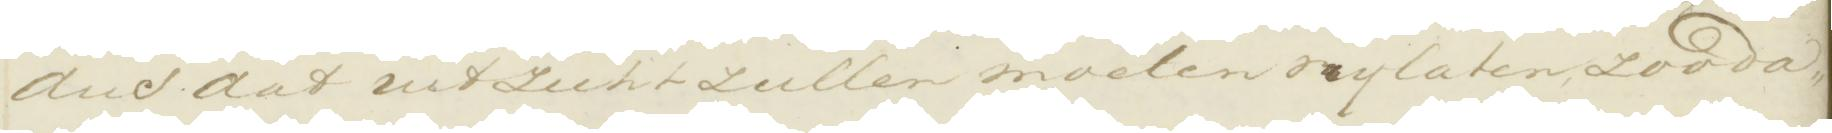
dus dat uitzicht zullen moeten vrylaten, zooda„
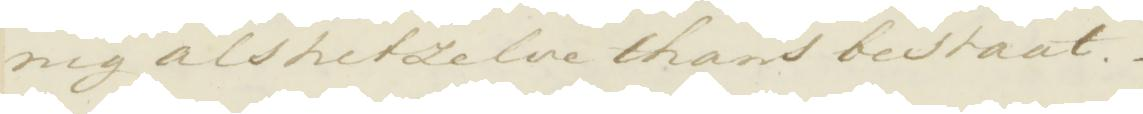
nig als hetzelve thans bestaat.
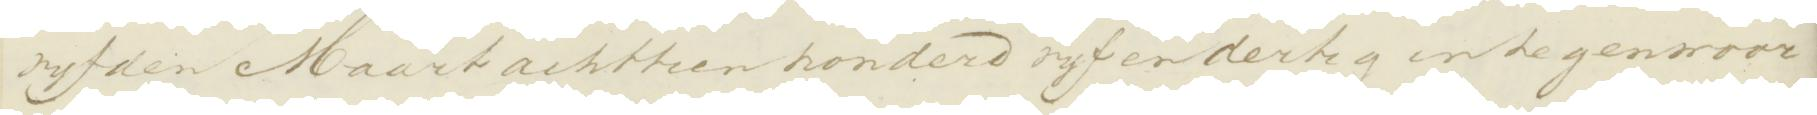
vyfden Maart achttien honderd vyf en dertig in tegenwoor
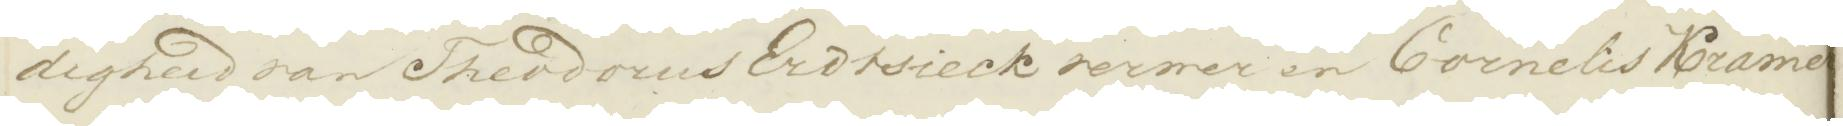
digheid van Theodorus Erdtsieck verwer en Cornelis Kramer
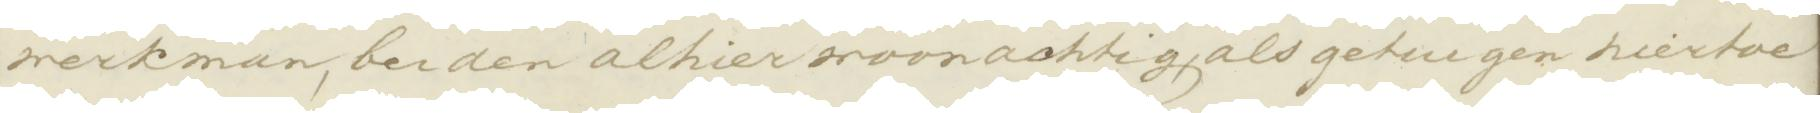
werkman, beiden alhier woonachtig, als getuigen hiertoe
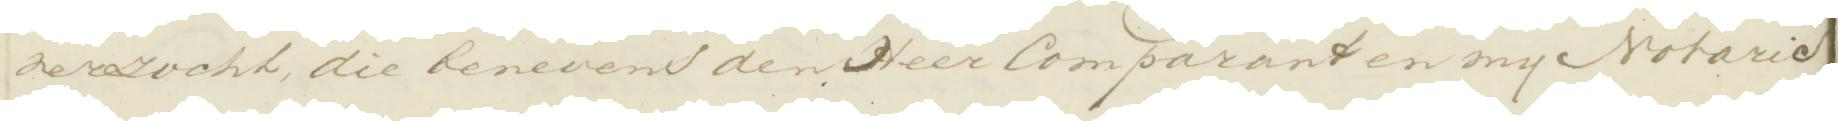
verzocht, die benevens den Heer Comparant en my Notaris
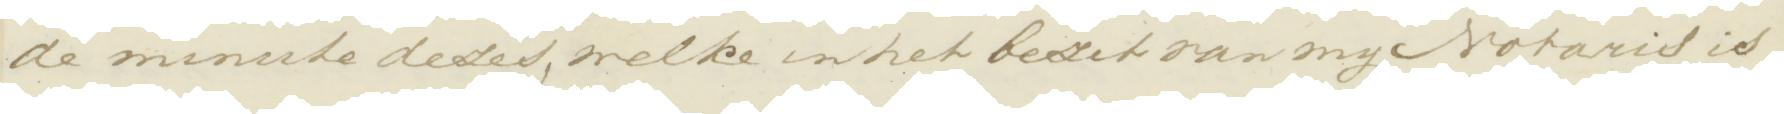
de minute dezes, welke in het bezit van my Notaris is
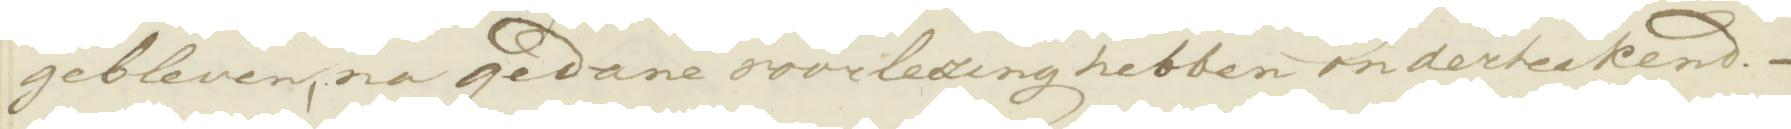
gebleven, na gedane voorlezing hebben onderteekend. —
